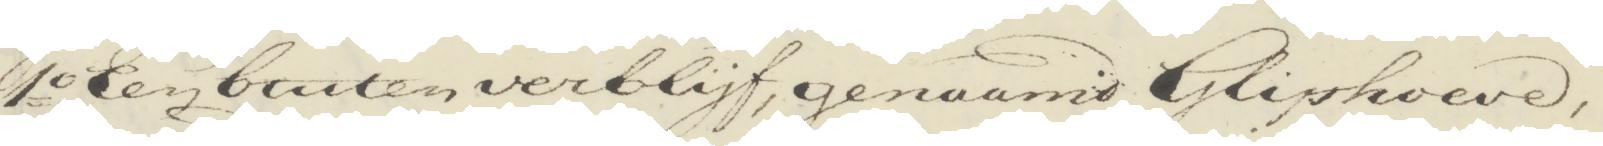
1=o Een buiten verblijf, genaamd Gliphoeve,
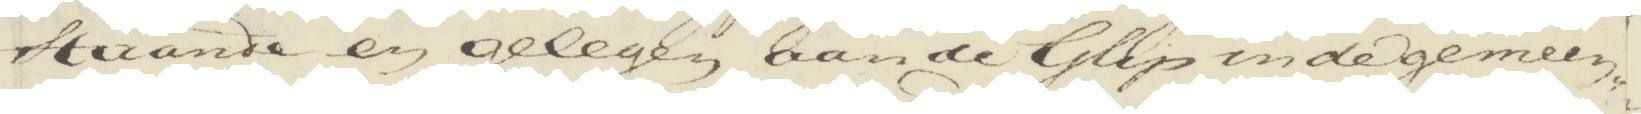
staande en gelegen aan de Glip in de gemeen„
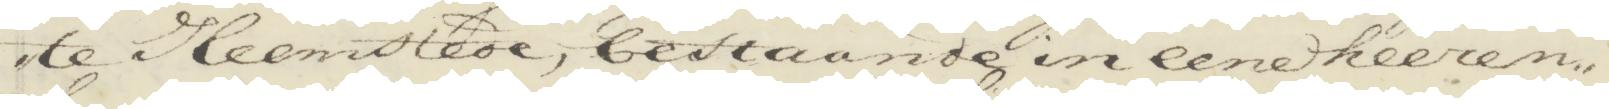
„te Heemstede, bestaande in eene heeren„
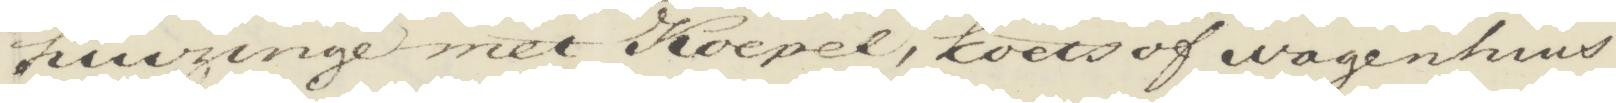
huizinge met Koepel, koets of wagenhuis
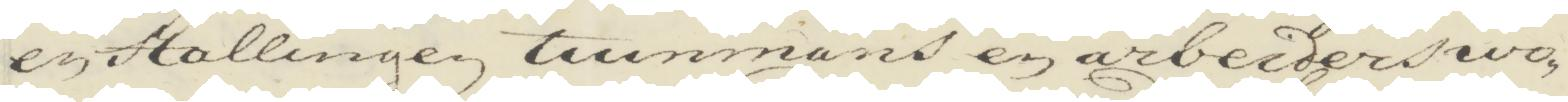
en stallingen tuinmans en arbeiders wo„
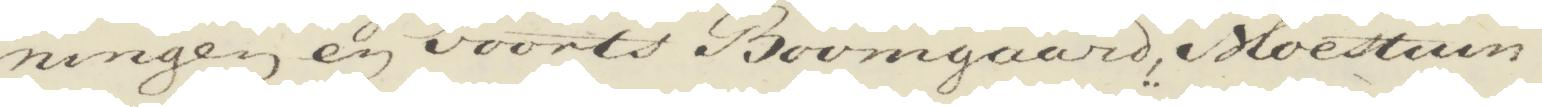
ningen en voorts Boomgaard, Moestuin
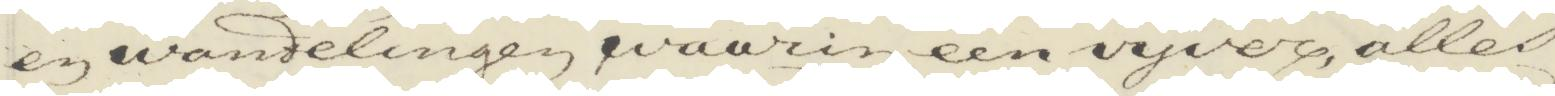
en wandelingen waarin een vijver, alles
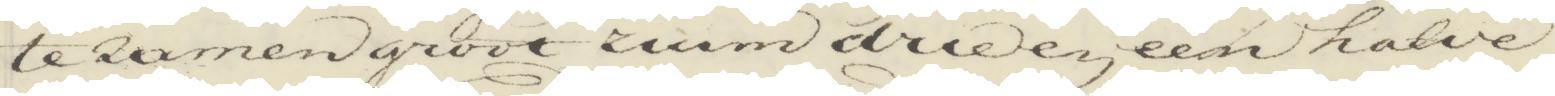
te zamen groot ruim drie en een halve
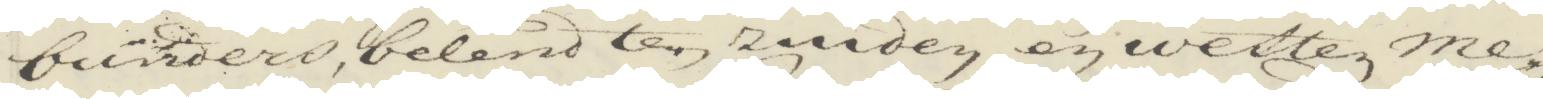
bunders, belend te zuiden en westen me
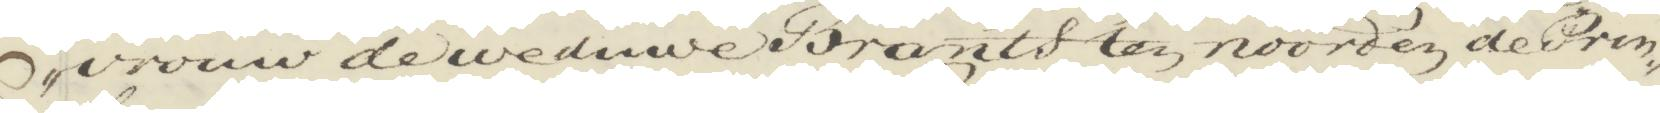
„vrouw de weduwe Brants ten noorden de Prin„
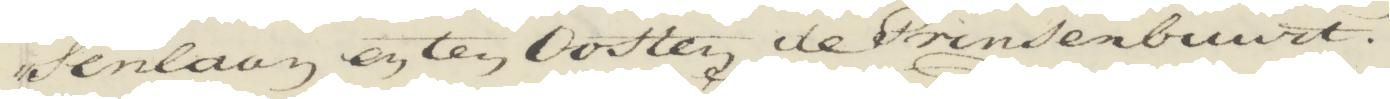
„senlaan en ten Oosten de Prinsenbuurt.
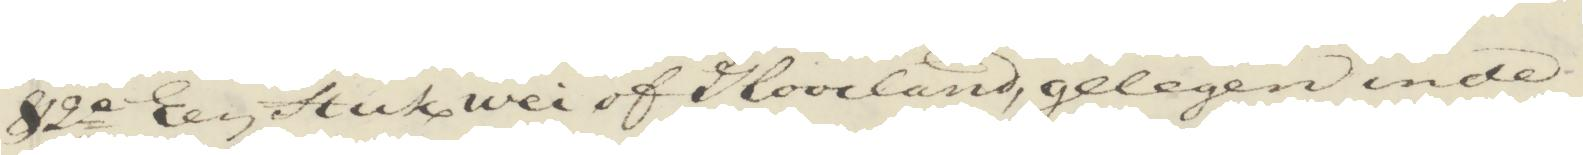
& 2=o Een stuk wei of Hooiland, gelegen in de
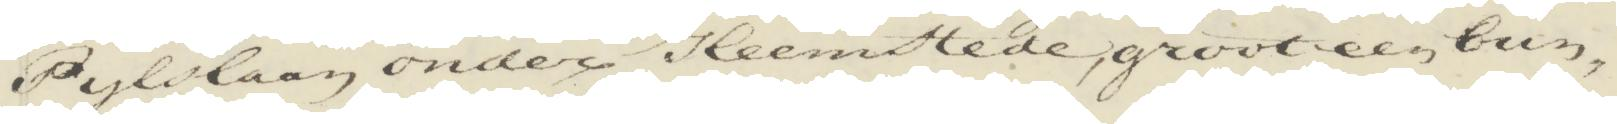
Pylslaan onder Heemstede, groot een bun„
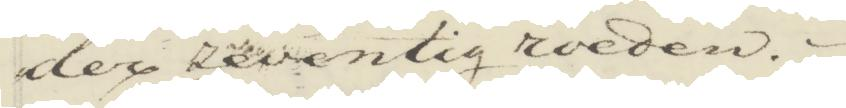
der zeventig roeden.-
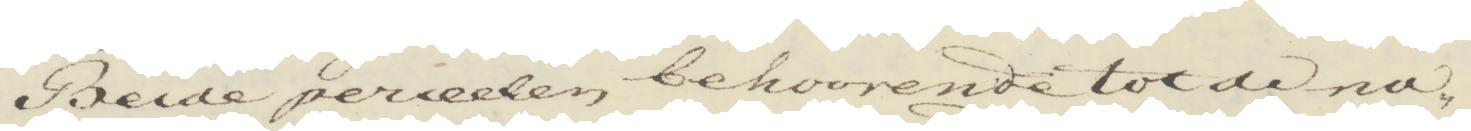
Beide perceelen behoorende tot de na„
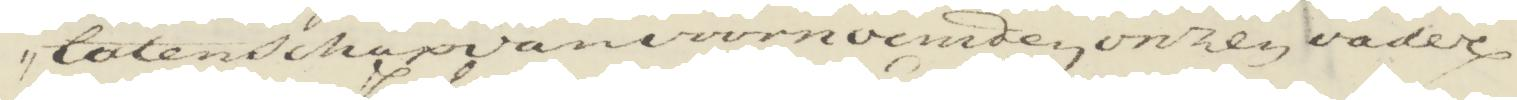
„latenschap van voornoemden onzen vader
